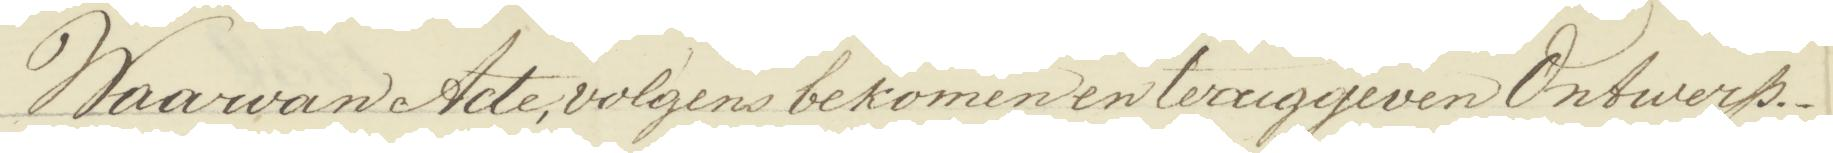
Waarvan Acte, volgens bekomen en teruggeven Ontwerp. –
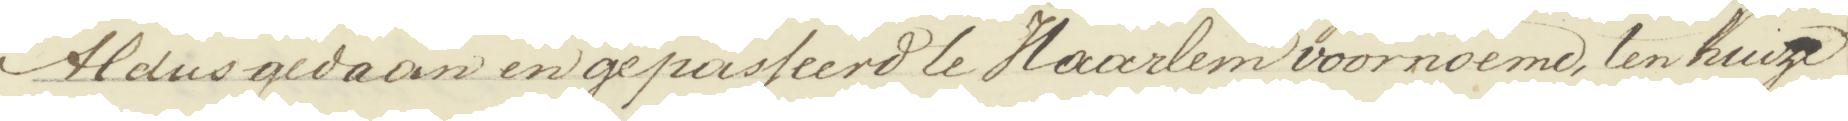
Aldus gedaan en gepasseerd te Haarlem voornoemd, ten huize
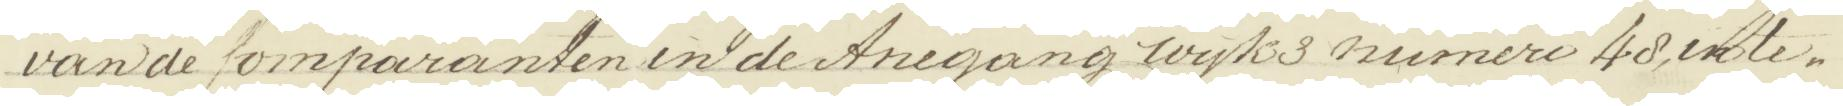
van de Comparanten in de Anegang wyk 3 numero 48, inte„
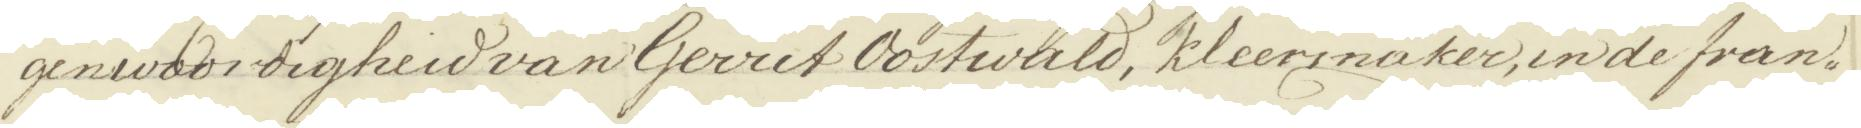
genwoordigheid van Gerrit Oostwald, Kleermaker, in de fran„
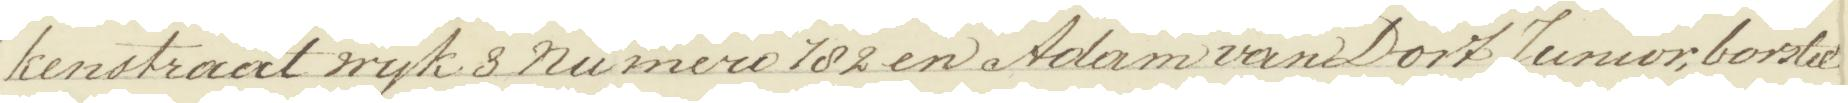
kenstraat wyk 3 numero 182 en Adam van Dort Junior, borstel
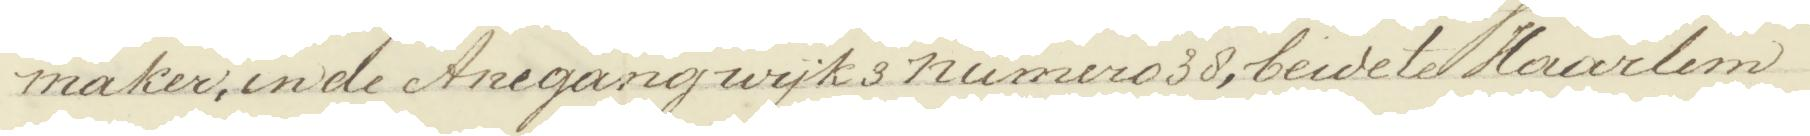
maker, in de Anegang wijk 3 numero 38, beide te Haarlem
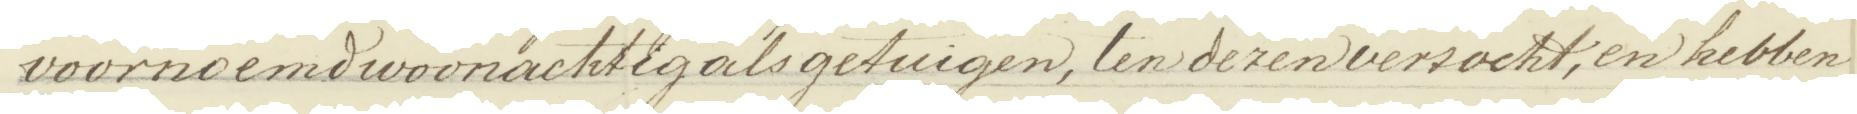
voornoemd woonachtig als getuigen, ten dezen verzocht, en hebben
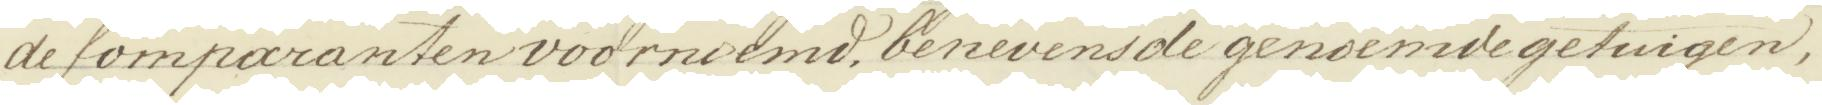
de Comparanten voornoemd, benevens de genoemde getuigen,
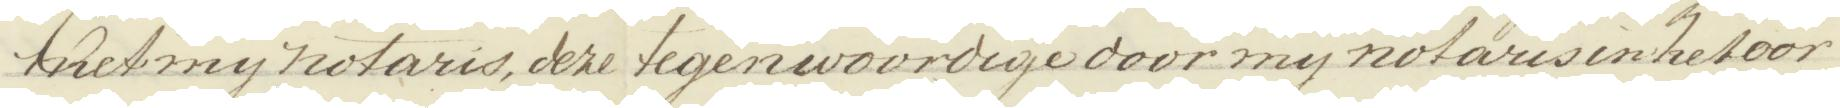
met my notaris, deze tegenwoordige door my notaris in het oor
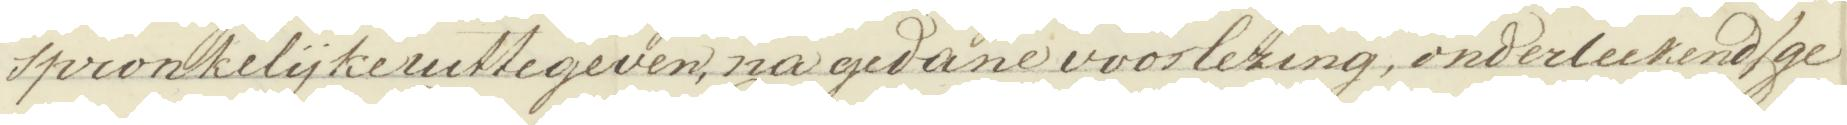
spronkelijke uittegeven, na gedane voorlezing, onderteekend /ge
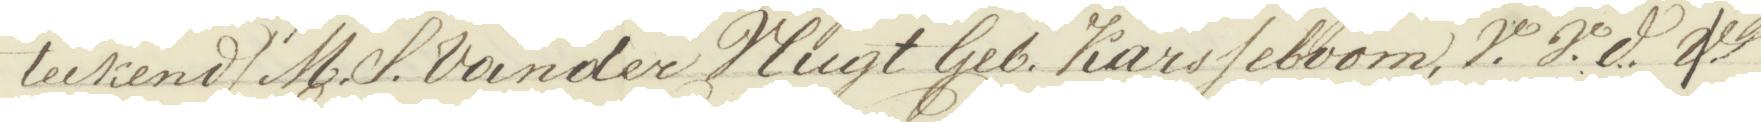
teekend/ M.S. vander Vlugt Geb. Karsseboom, V. V. d. d.
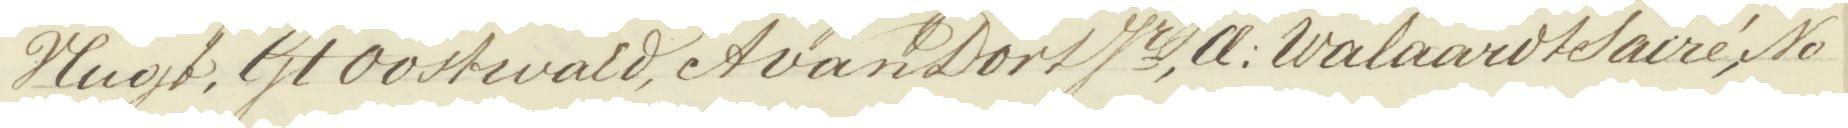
Vlugt, Gt Oostwald, A van Dort J=r, AE: Walaardt Sacré, No
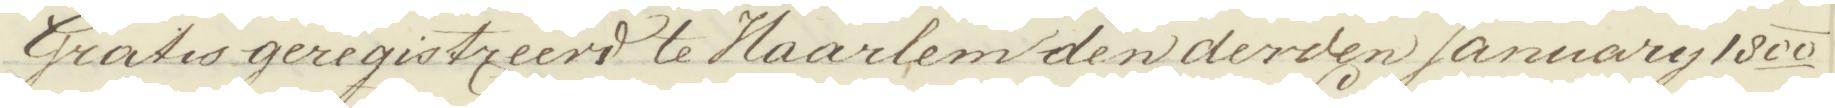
Gratis geregistreerd te Haarlem den derden January 1800
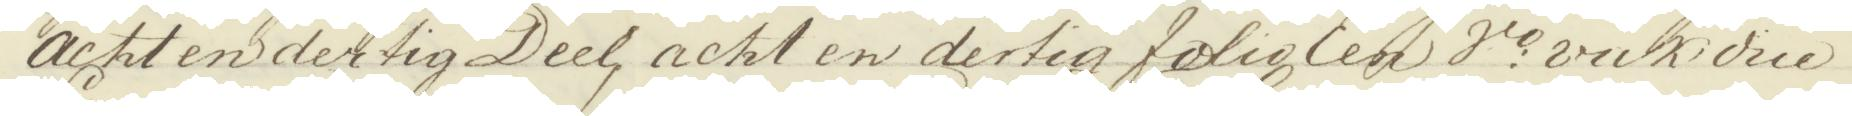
acht en dertig Deel acht en dertig folio Een V:o vak drie
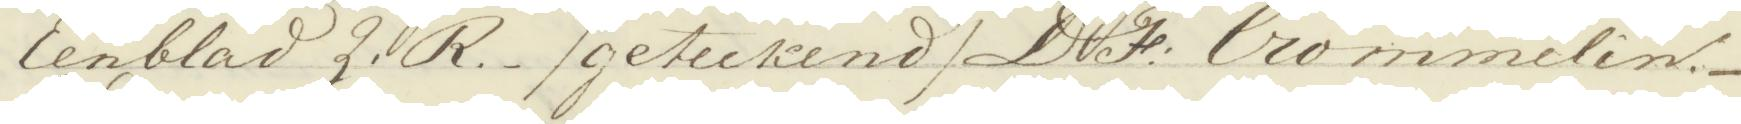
Een blad Z.R. - /geteekend/ DF: Crommelin.
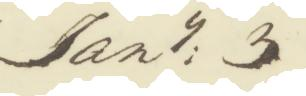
Jan:y 3
